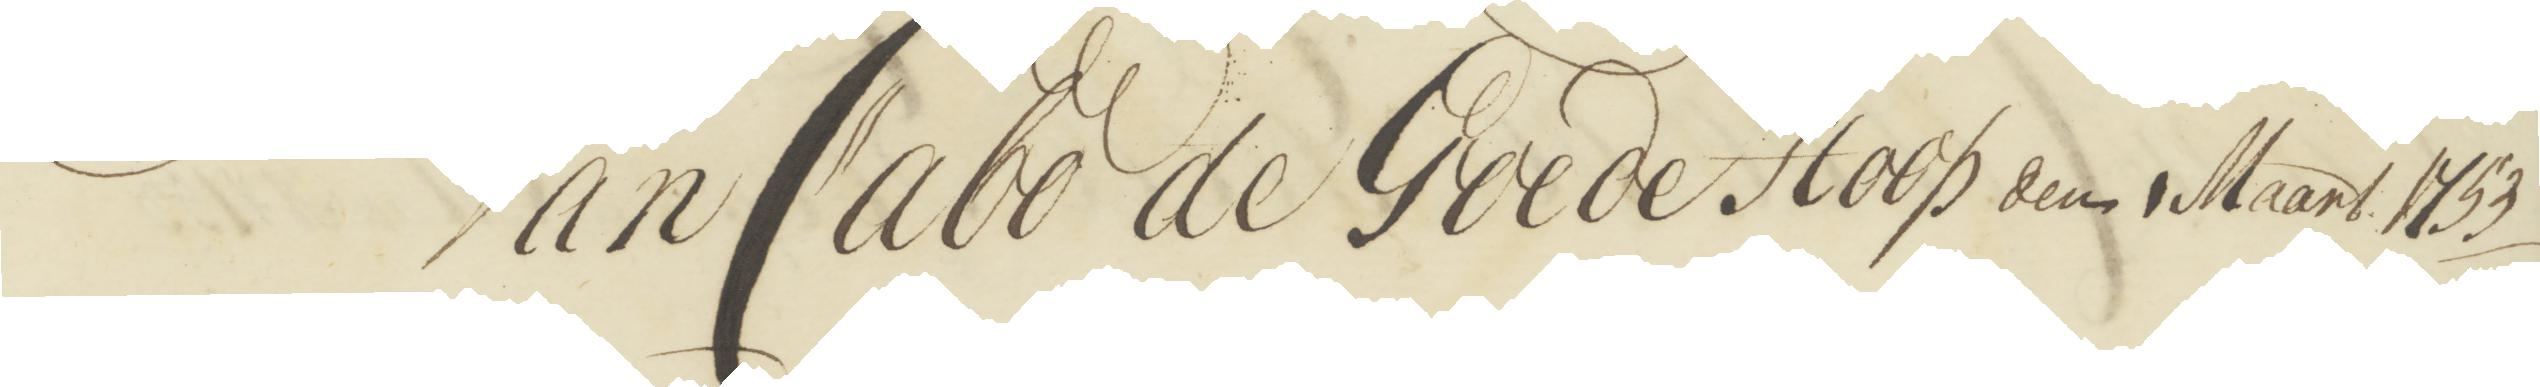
Van Cabo de Goede Hoop den Maart: 1753
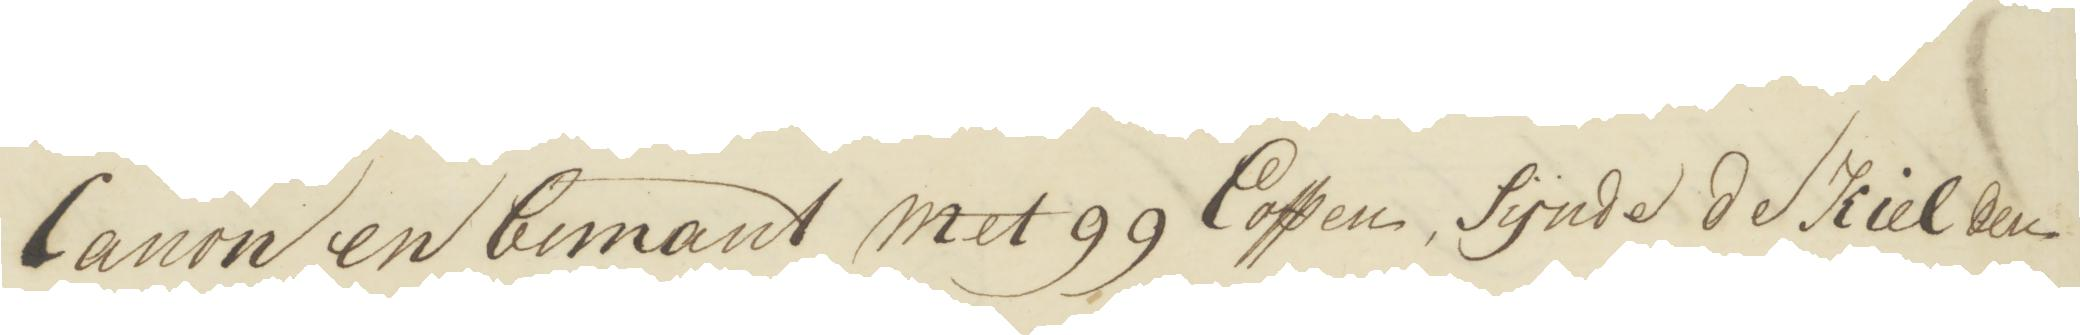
Canon en bemant met 99 Coppen, sijnde de kiel den
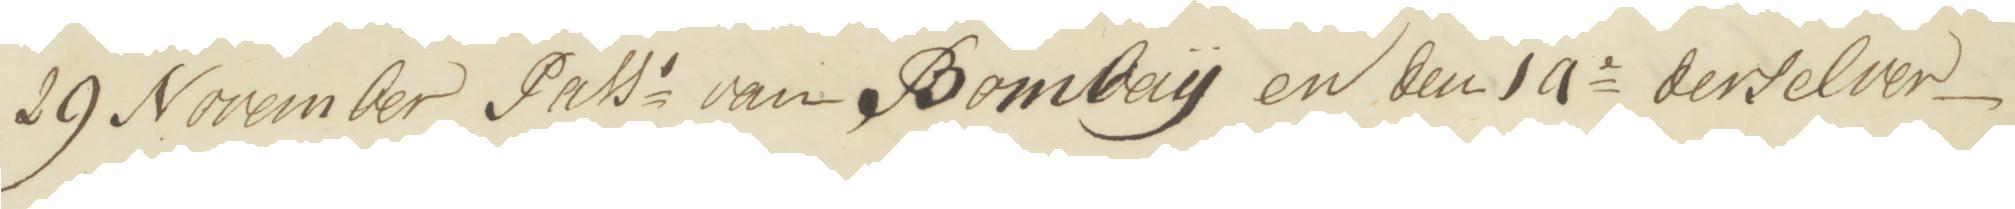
29 November Pass=o van Bombaij en den 14=e derselver—
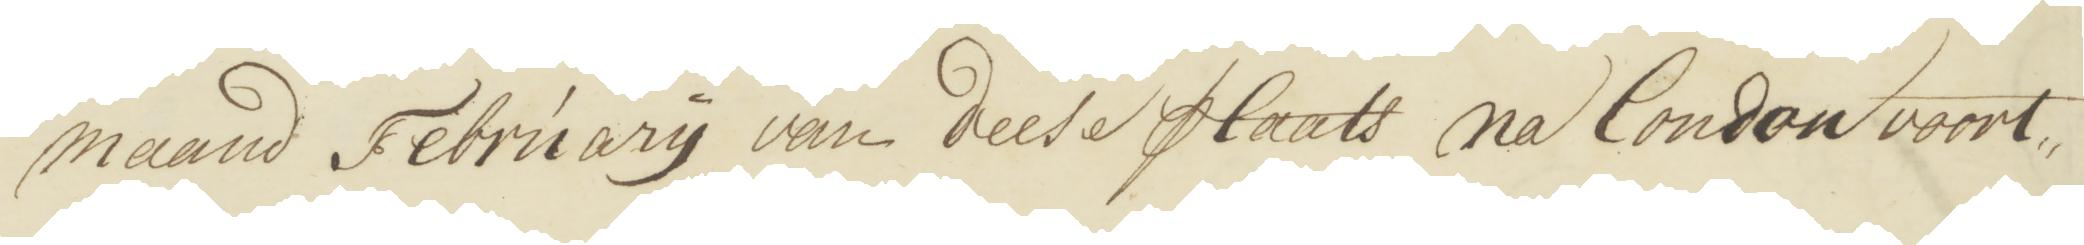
maand Februarij van deese plaats na Condon voort„
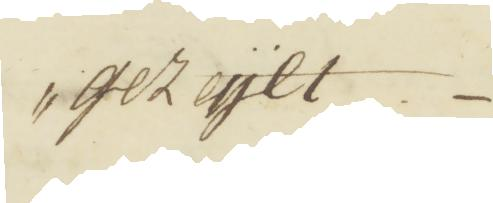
„gezeijlt. —
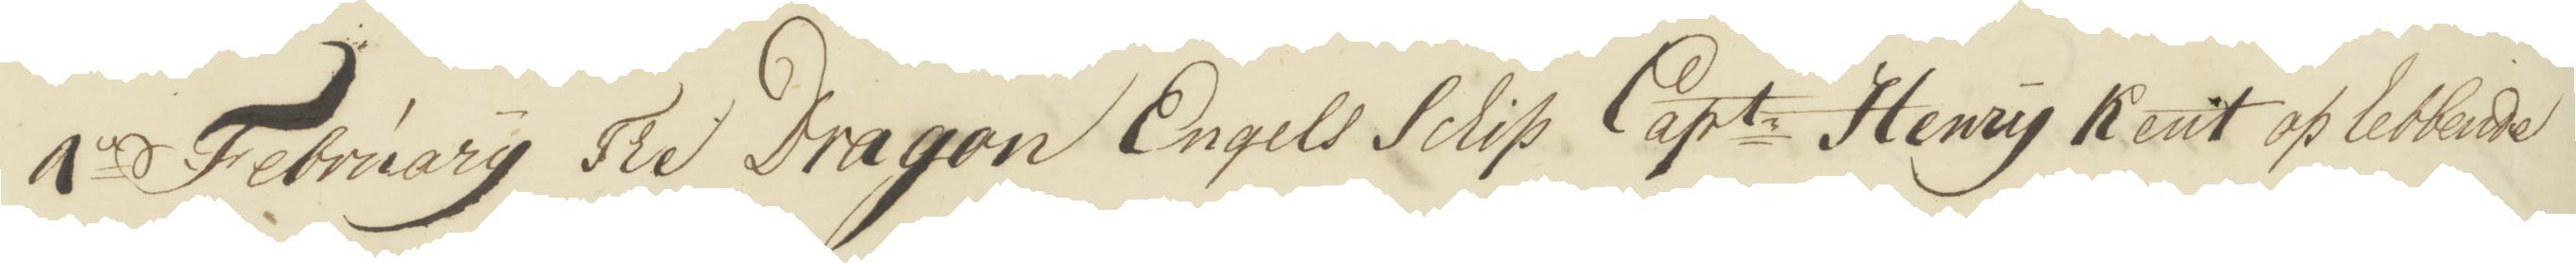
4=e Februarij The Dragon Engels schip Cap=tn Henrij Kent op hebbende
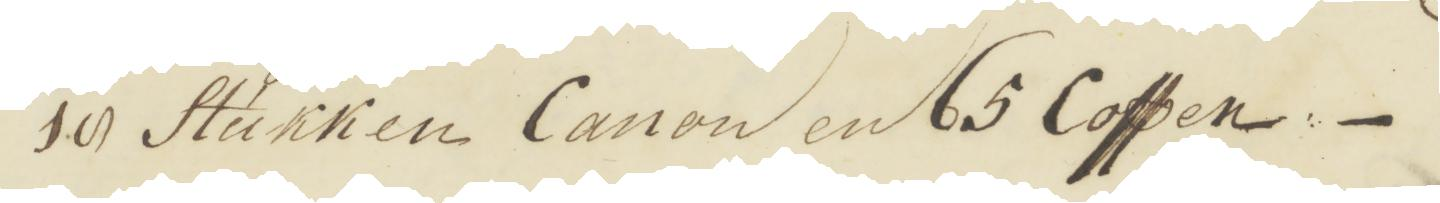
18 stukken Canon en 65 Copper: —
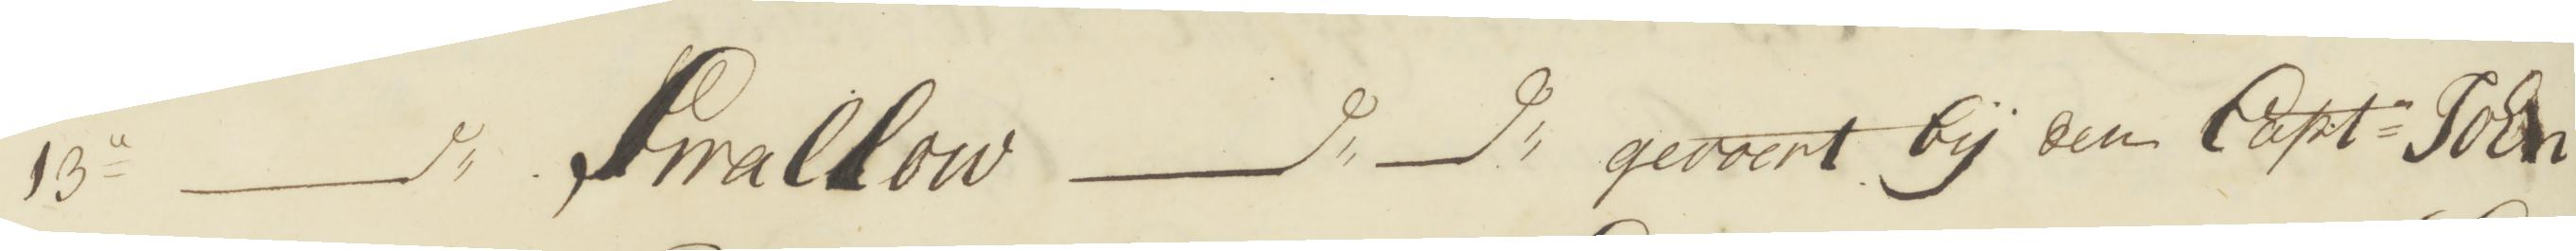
13=e _„o Swallow _„o _„o gevoert bij den Capt=n Iohn
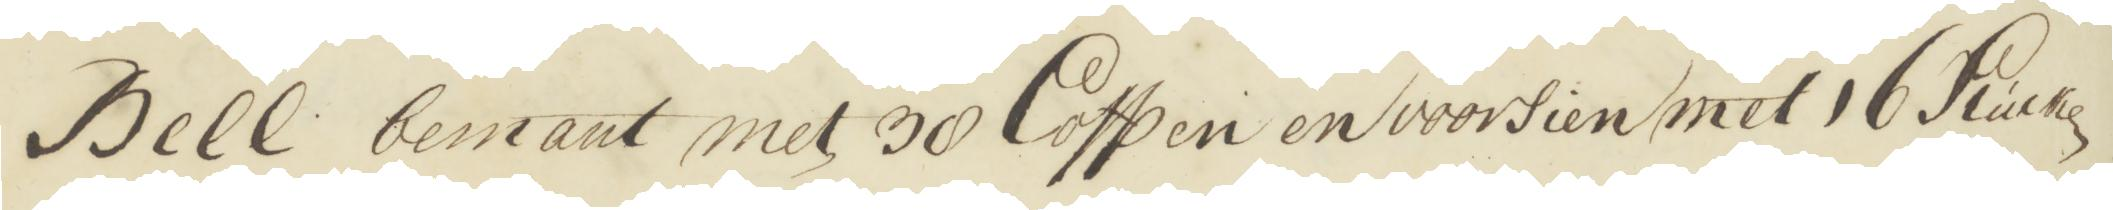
Bell bemant met 38 Coppen en voorsien met 16 Stucken
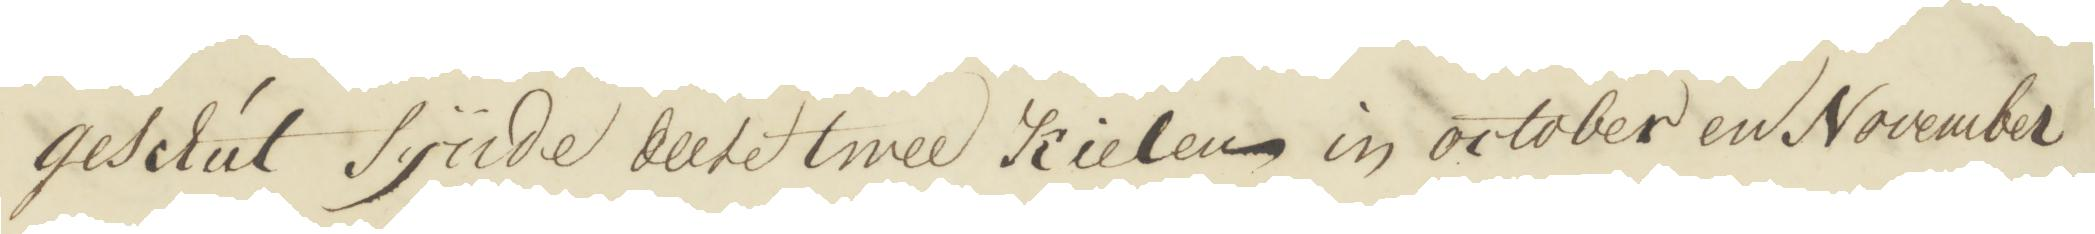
geschut sijnde deese twee kielen in october en November
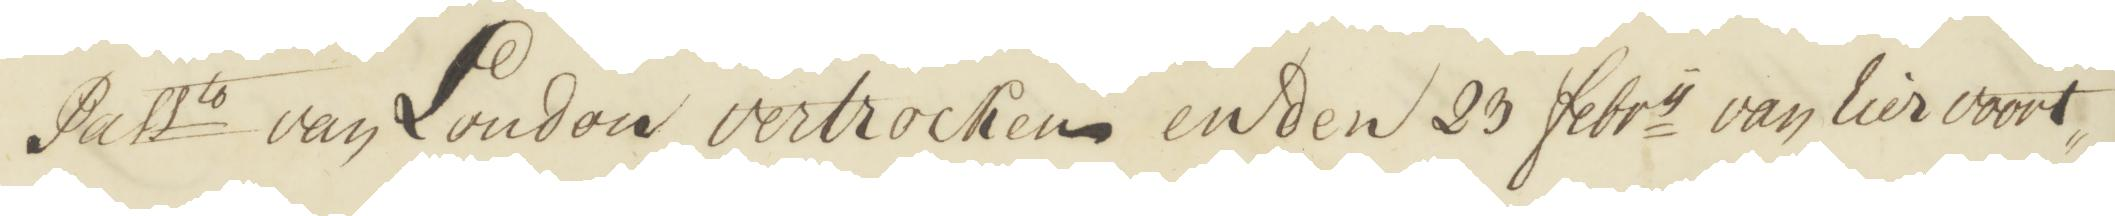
Pass=to van London vertrocken en den 23 febr=ij van hier voort„
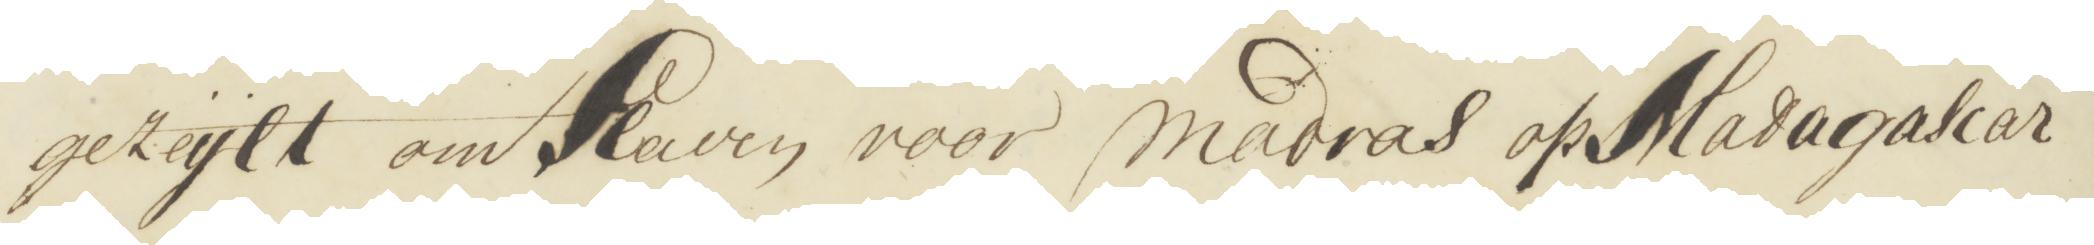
gezeijlt om Slaven voor madras op Madagascar
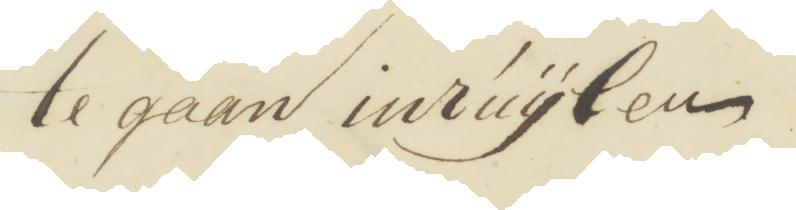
te gaan inruijlen
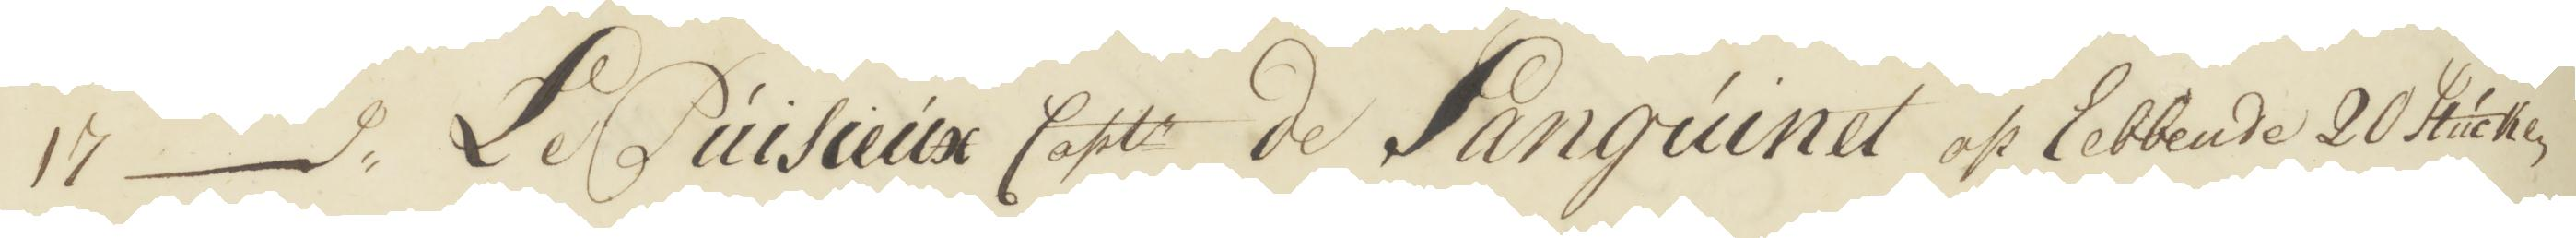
17 _„o Le Puisieur Capt=n de Sanguinet op hebbende 20 stucken
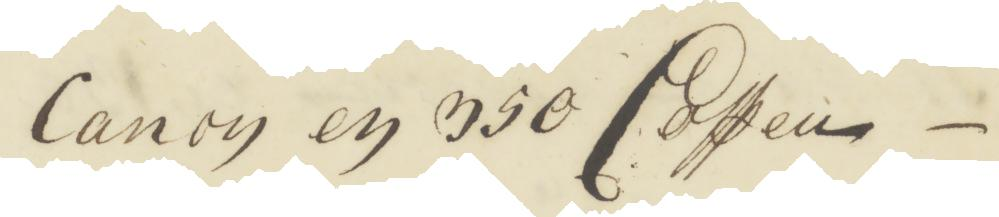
Canon en 350 Coppen —
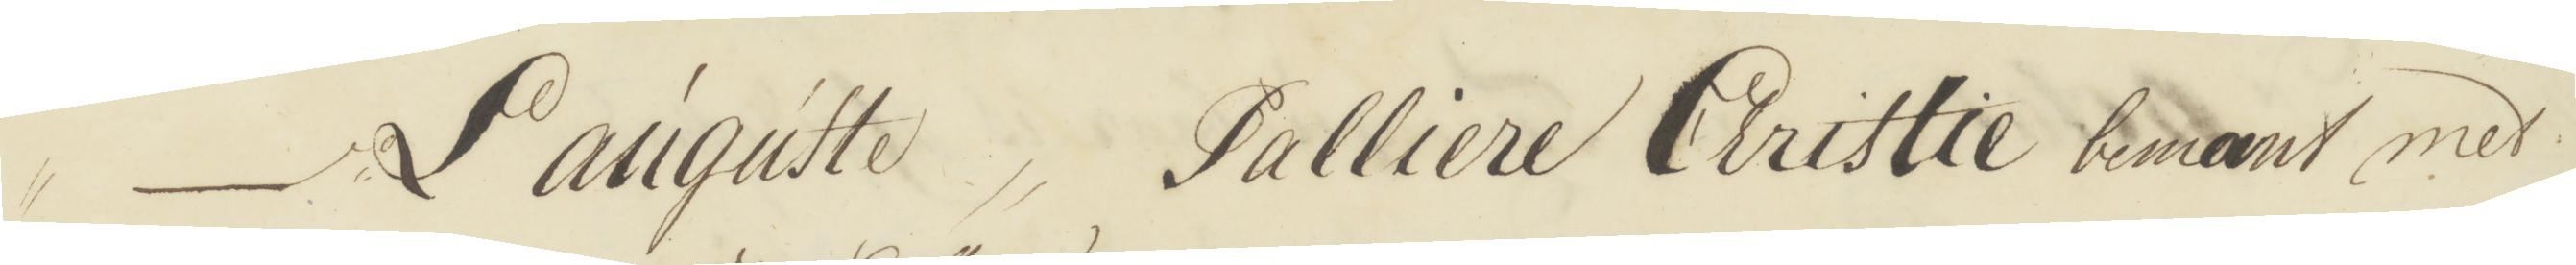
„ _„o L auguste „ Palliere Christie bemant met
